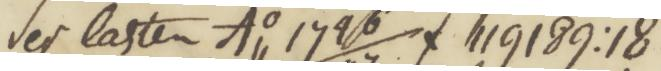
er lasten A„o 1746/47 ƒ 119189:18
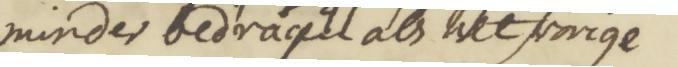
minder bedrage als het vorige
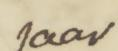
jaar
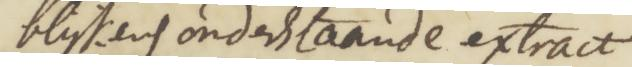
blijkens onderstaande extract
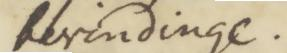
bevindinge.
